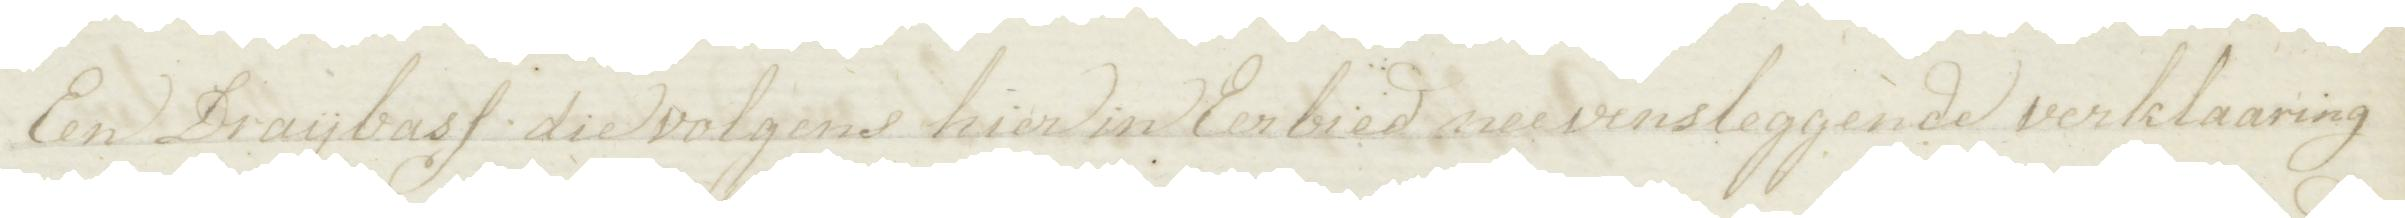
Een Draijbass die volgens hier in Eerbied neevens leggende verklaaring
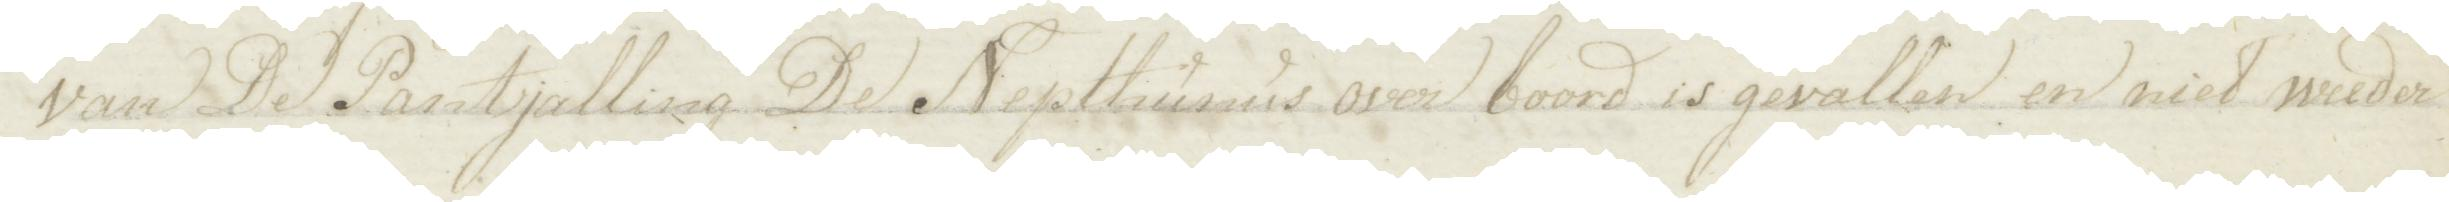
van De Pantjalling De Nepthunus over boord is gevallen en niet weeder
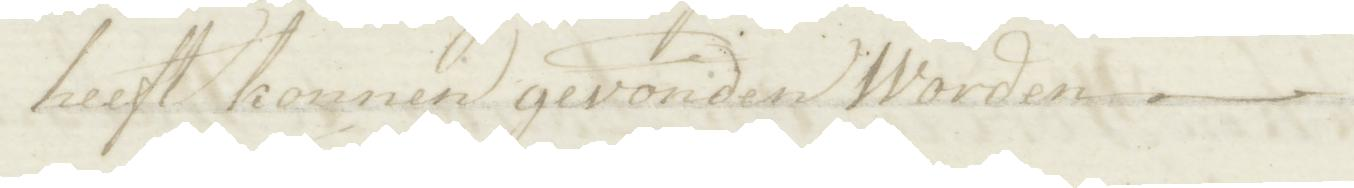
heeft konnen gevonden Worden —
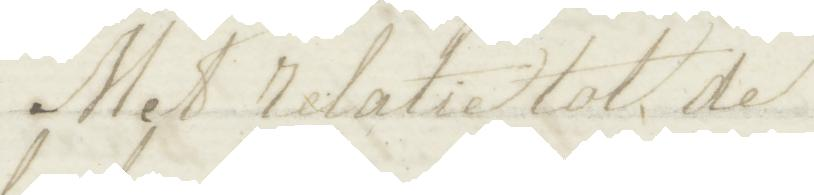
Met relatie tot de
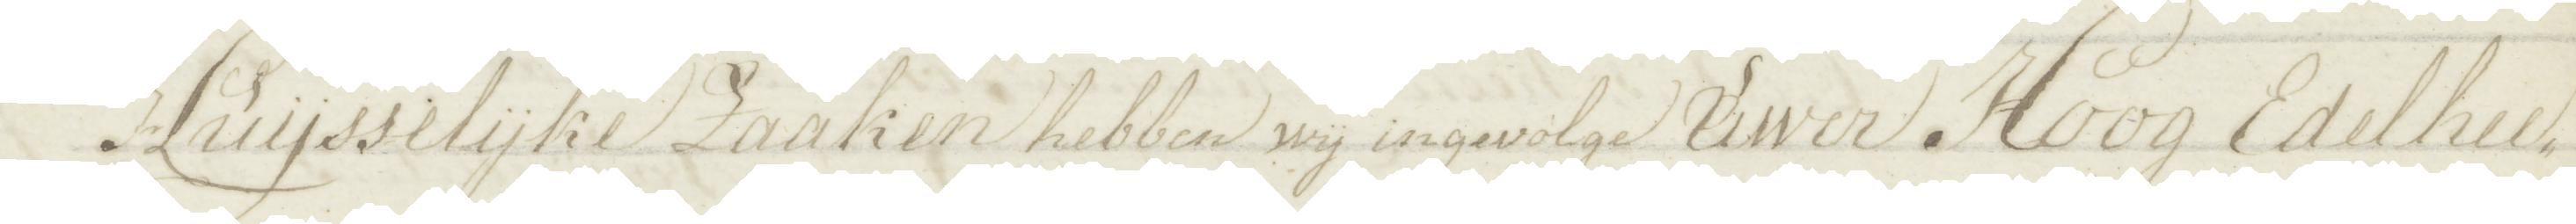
Huijsselijke Zaaken hebben wij ingevolge Uwer Hoog Edelhee„
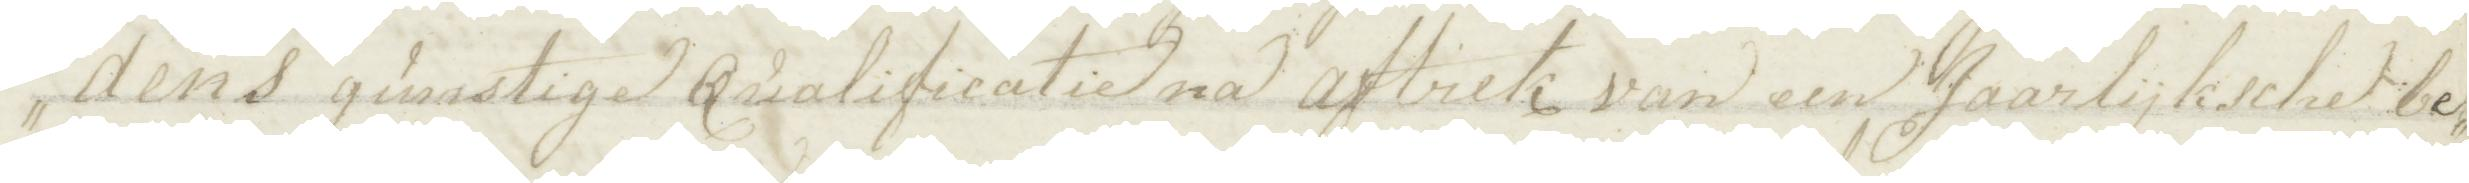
„dens gunstige Qualificatie na aftrek van een Jaarlijksche be
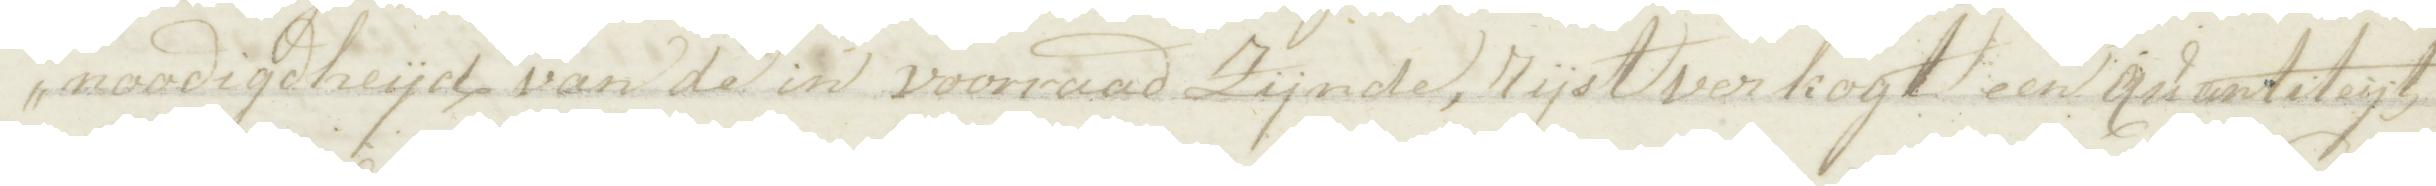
„noodigdheijd van de in voorraad Zijnde, Rijst verkogt een quantiteijt
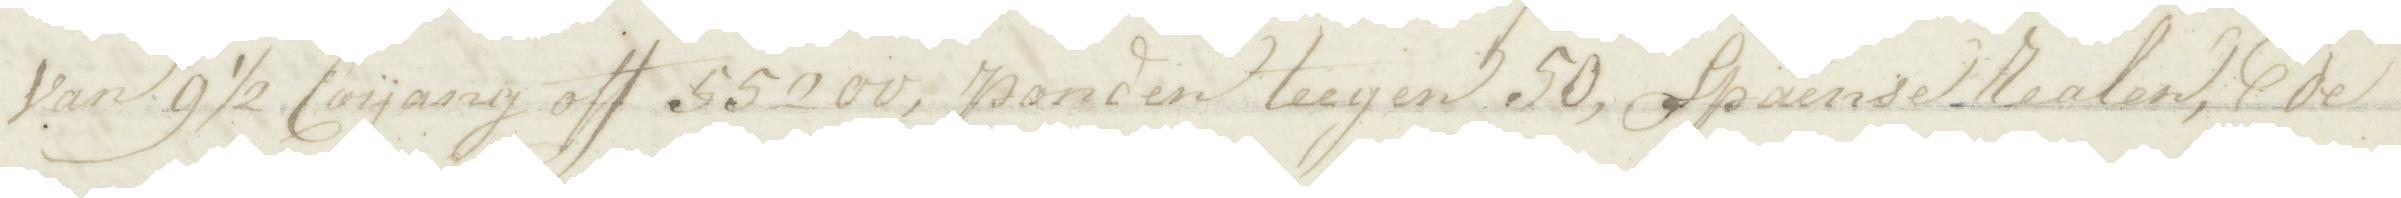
van 9½ Coijang off 55200, ponden teegen 50, Spaense Realen, de
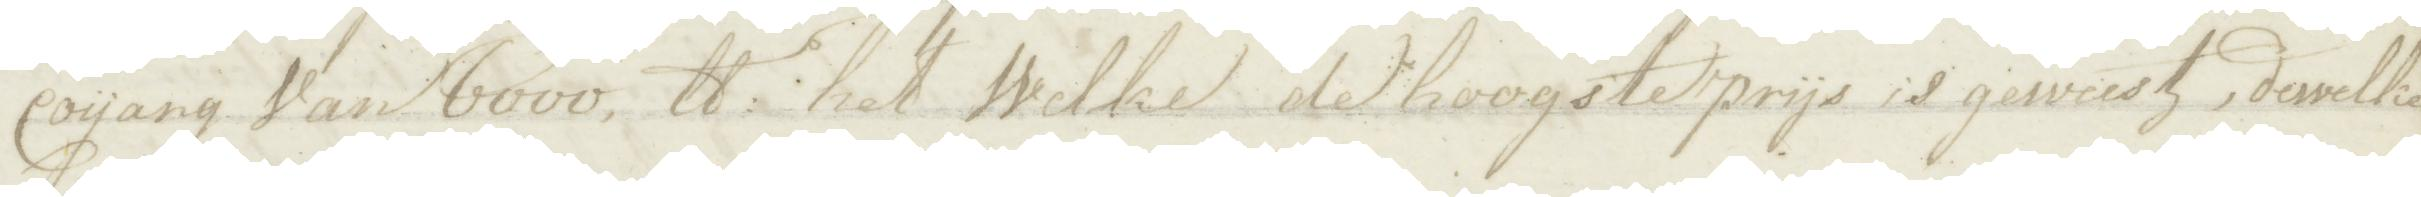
Coijang van 6000, lb:s het Welke de hoogste prijs is geweest, dewelke
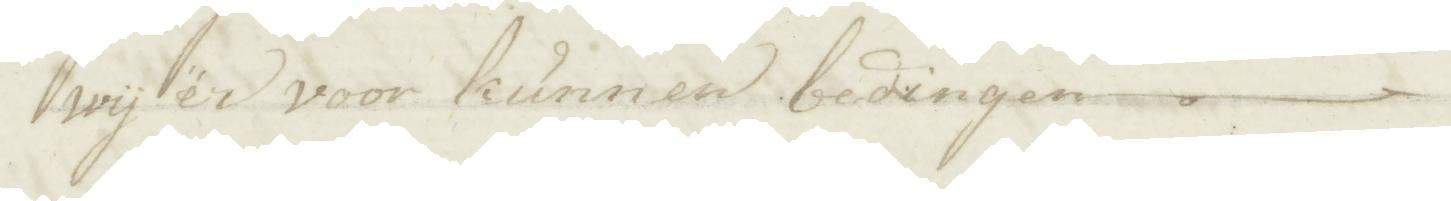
wij 'er voor kunnen bedingen. —
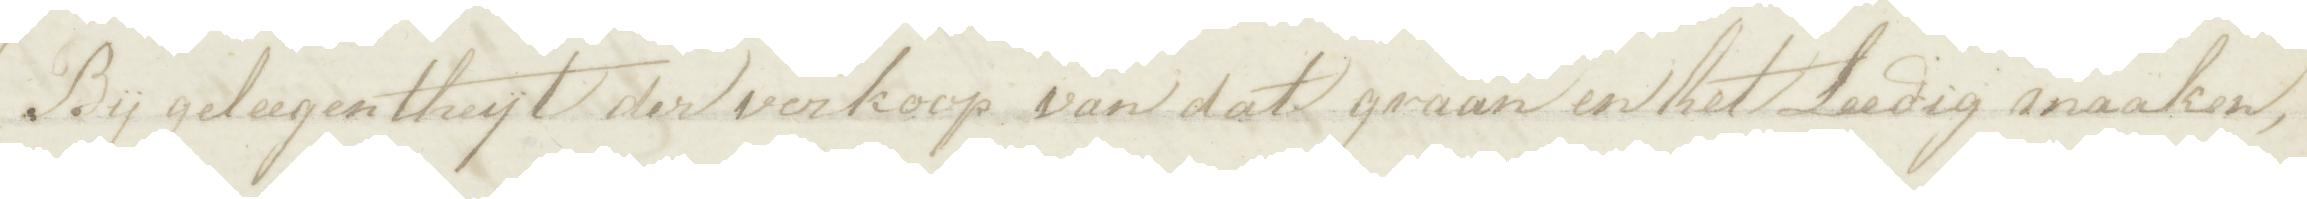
Bij geleegentheijt der verkoop van dat graan en het Leedig maaken,
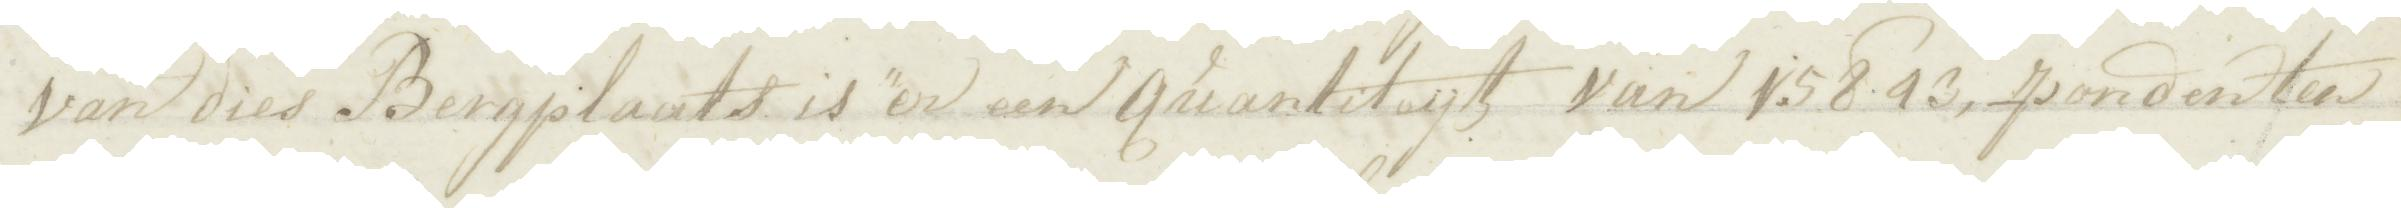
van dies Bergplaats is 'er een Quantiteijt van 15843, ponden ter
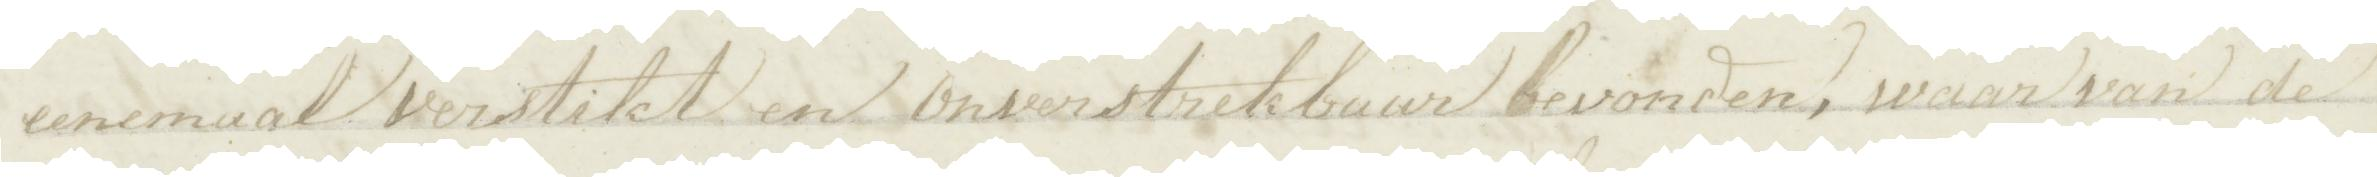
eenemaal verstikt en onverstrekbaar bevonden, waar van de
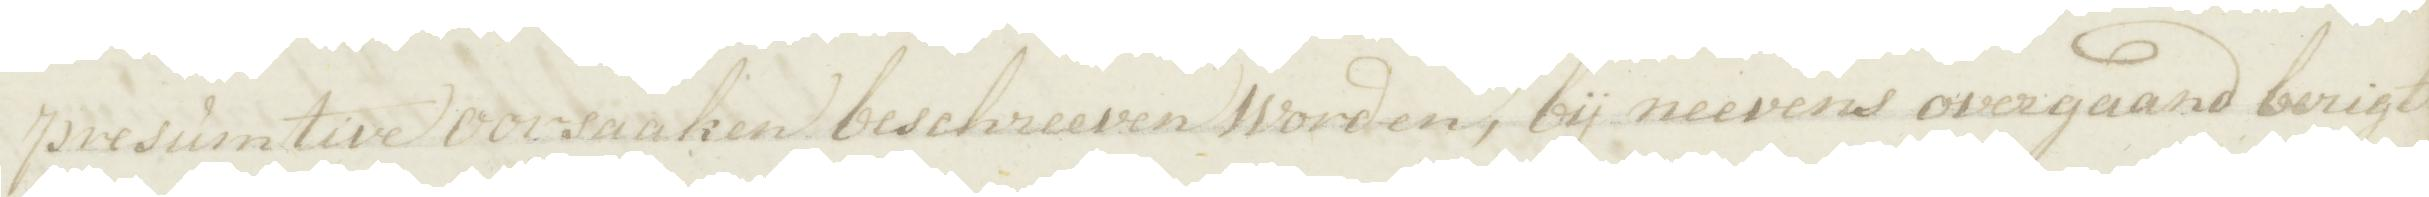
presumtive oorsaaken beschreeven worden, bij neevens overgaand berigt
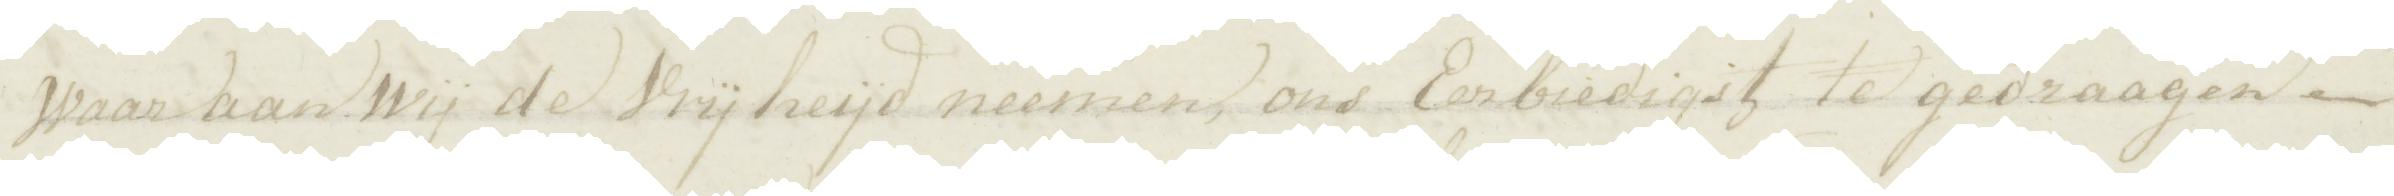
Waar aan wij de Vrijheijd neemen, ons Eerbiedigst te gedraagen —
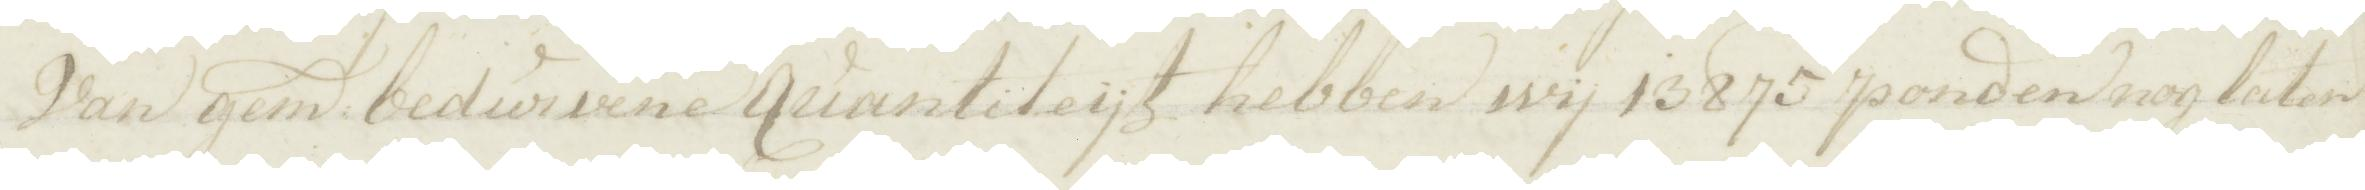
Van gem: bedurvene Quantiteijt hebben wij 13875 ponden nog laten
